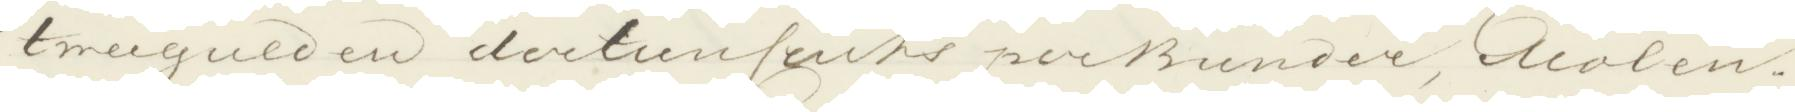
twee gulden dertien cents per Bunder, Molen„
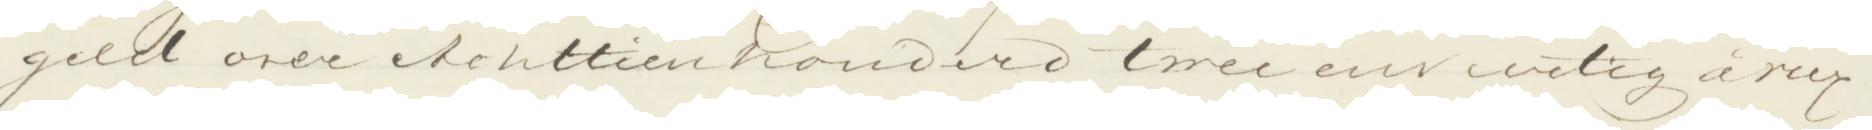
geld over Achttien honderd twee en veertig à vier
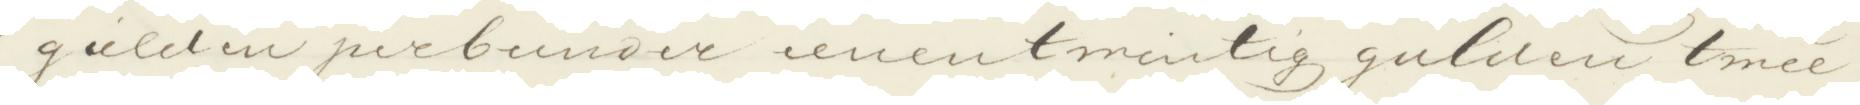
gulden per bunder eenen twintig gulden twee
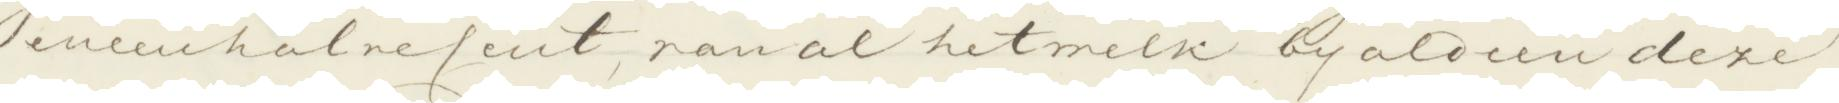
en een halve Cent, van al hetwelk by aldien deze
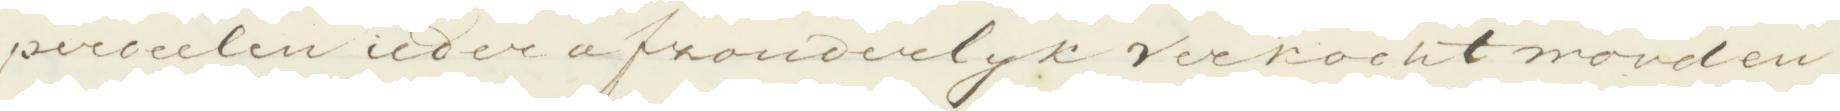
perceelen ieder afzonderlyk verkocht worden
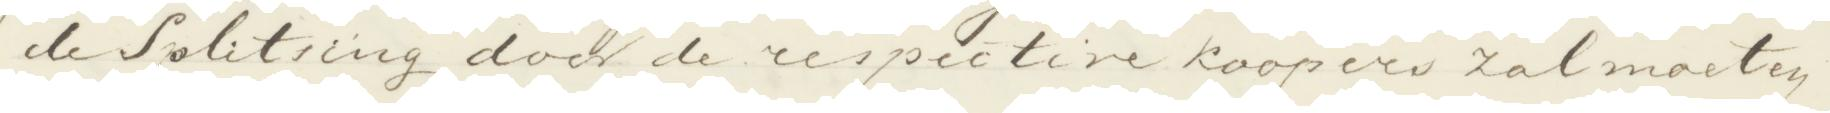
de splitsing door de respective koopers zal moeten
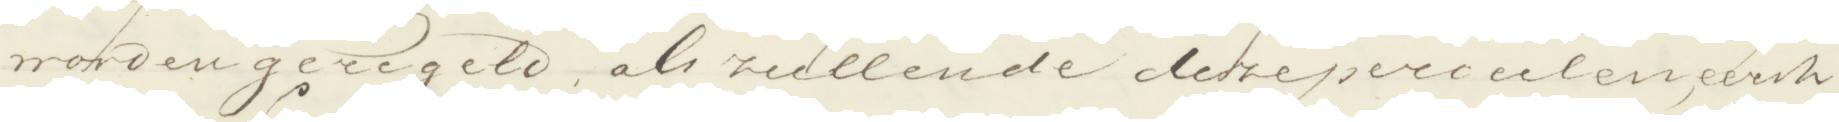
worden geregeld, als zullende deze perceelen, eerst
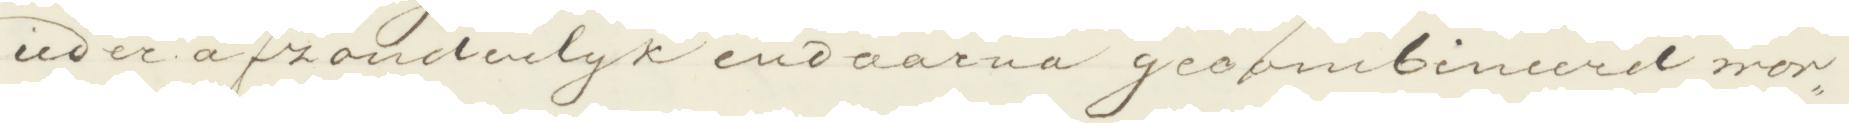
ieder afzonderlyk en daarna gecombineerd wor„
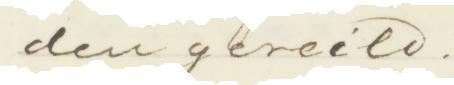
den geveild
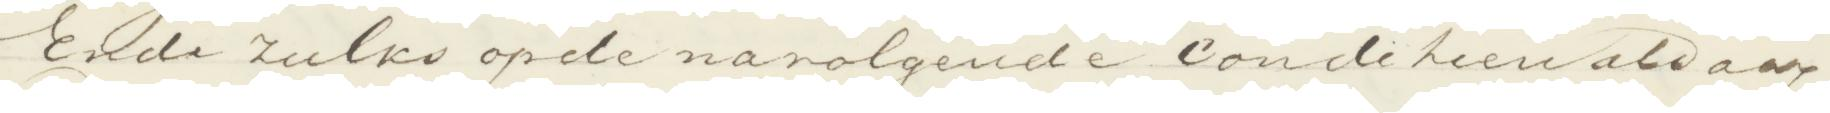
Ende zulks op de navolgende Conditien aldaar
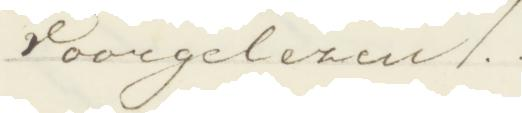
Voorgelezen.
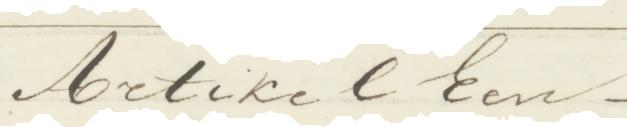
Artikel Een —
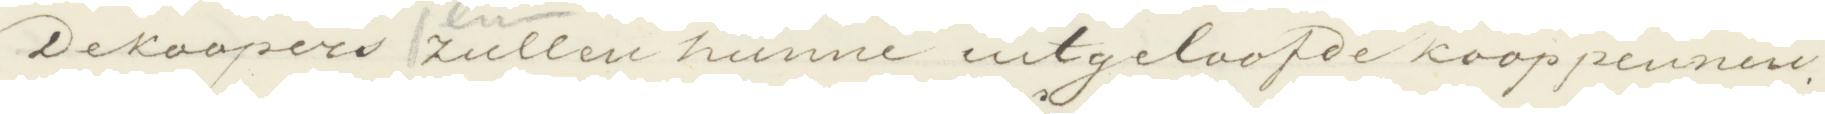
De koopers en zullen hunne uitgeloofde kooppennin„
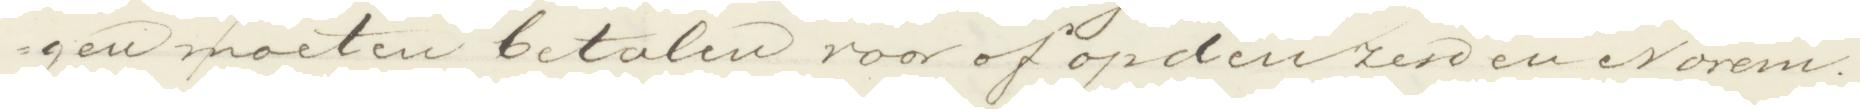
„gen moeten betalen voor of op den zesd en Novem.
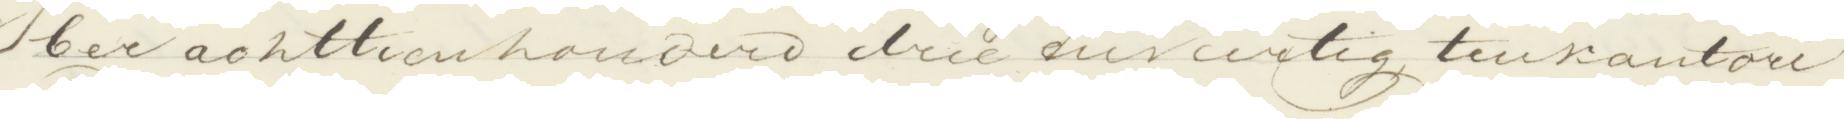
ber achttienhonderd drie enveertig ten kantore
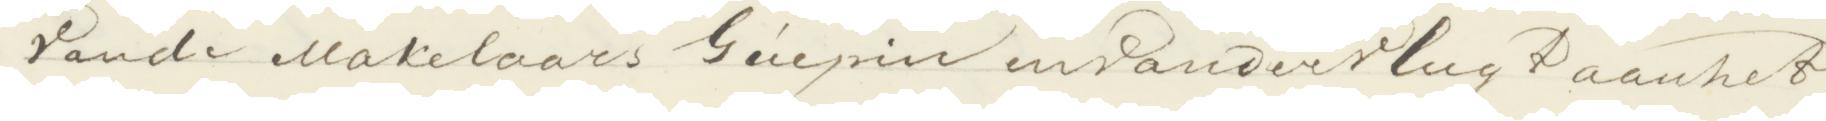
Vande Makelaars Guepin en Vander vlugt aan het
